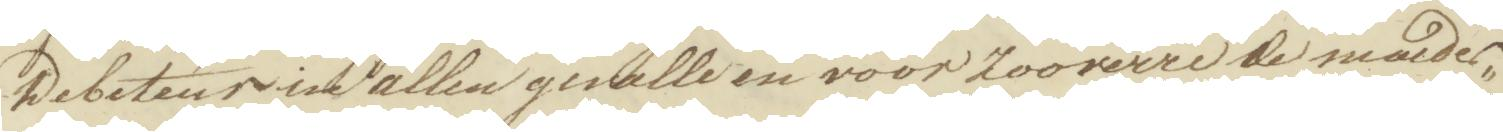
Debiteur in allen gevalle en voor zooverre de moeder„
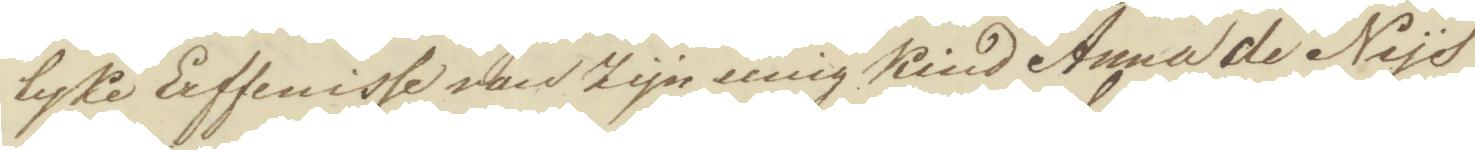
lyke Erffenisse van zijn eenig kind Anna de Nijs
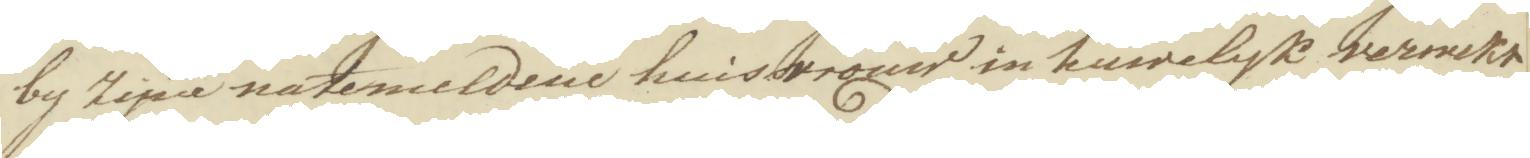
by zijne na te meldene huisvrouw in huwelyk verwekt
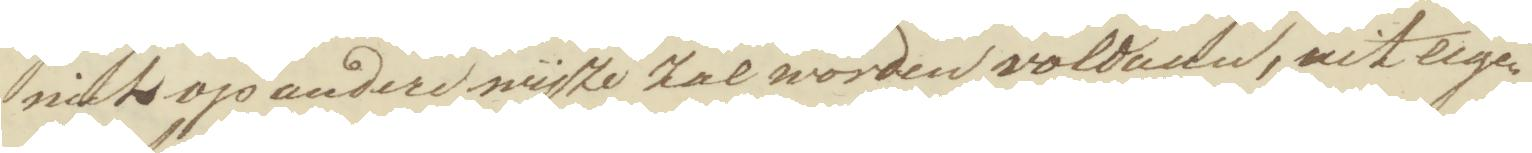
niets op andere wijze zal worden voldaan, uit eigen
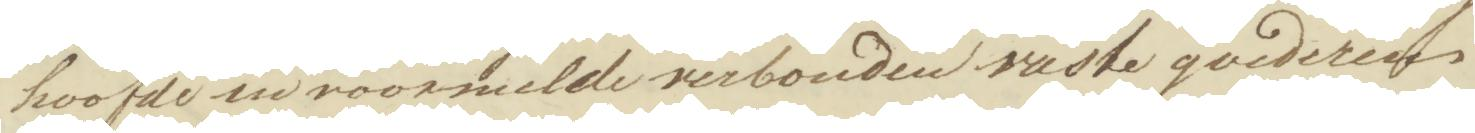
hoofde in voormelde verbonden vaste goederen —
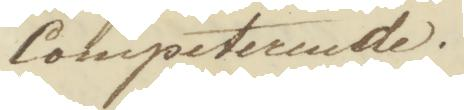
Competerende.
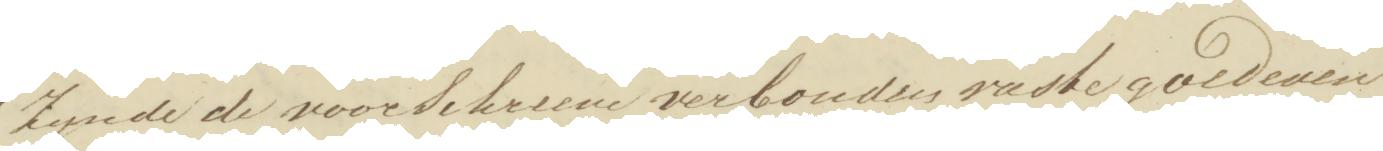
Zynde de voorschreeve verbonden vaste goederen
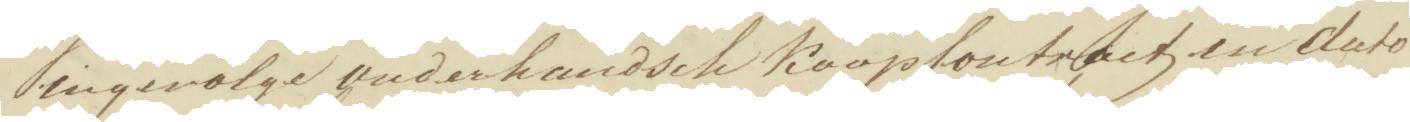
ingevolge onderhandsch koop Contract in dato
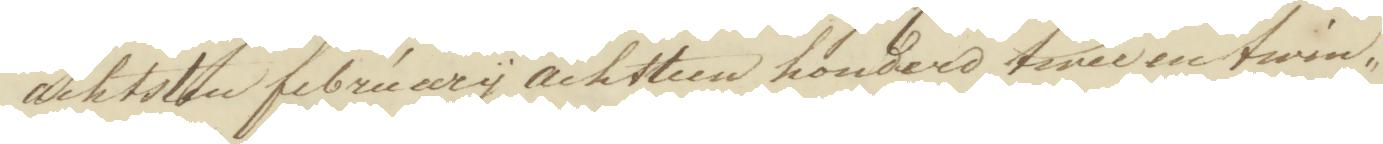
achtsten februarij achttien honderd twee en twin„
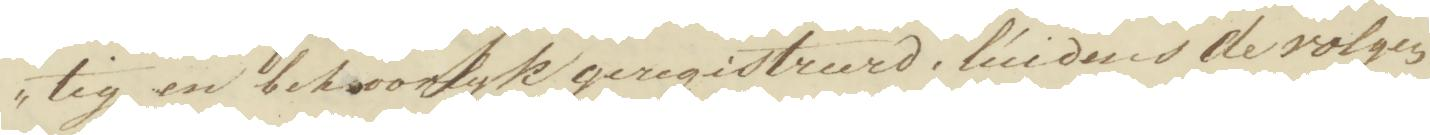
„tig en behoorlyk geregistreerd, luidens de volgen
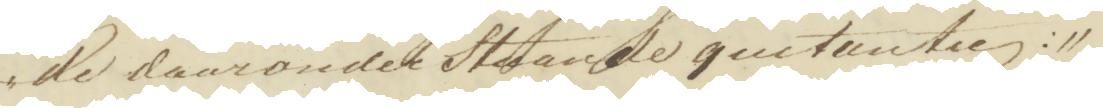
„de daaronder staande quitantien: „
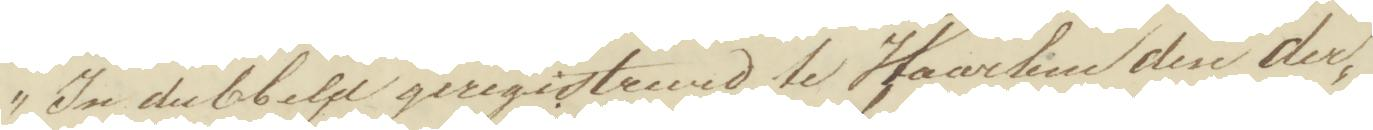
„ In dubbeld geregistreerd te Haarlem den der„
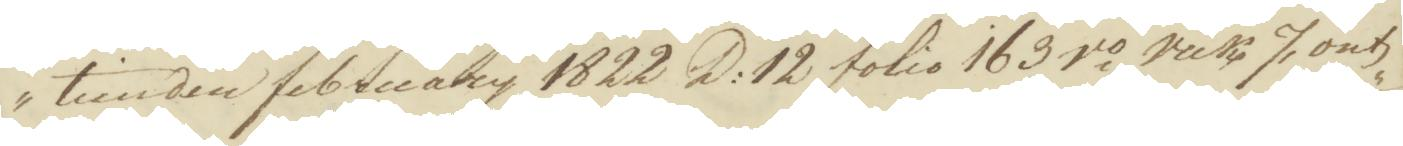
„ tienden february 1822 D: 12 folio 163 v=o vak 7, ont„
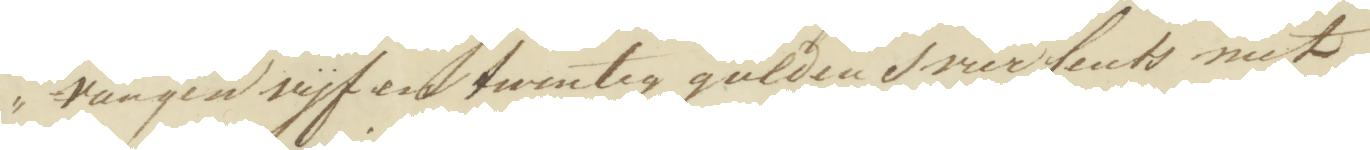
„ vangen vijf en twintig guldens vier Cents met
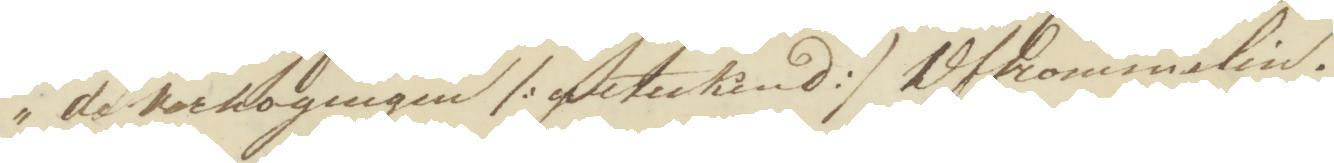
„ de verhogingen /: geteekend :/ D F Crommelin.
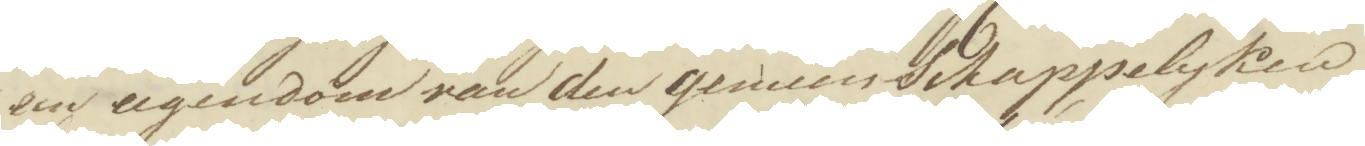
een eigendom van den gemeenschappelyken
